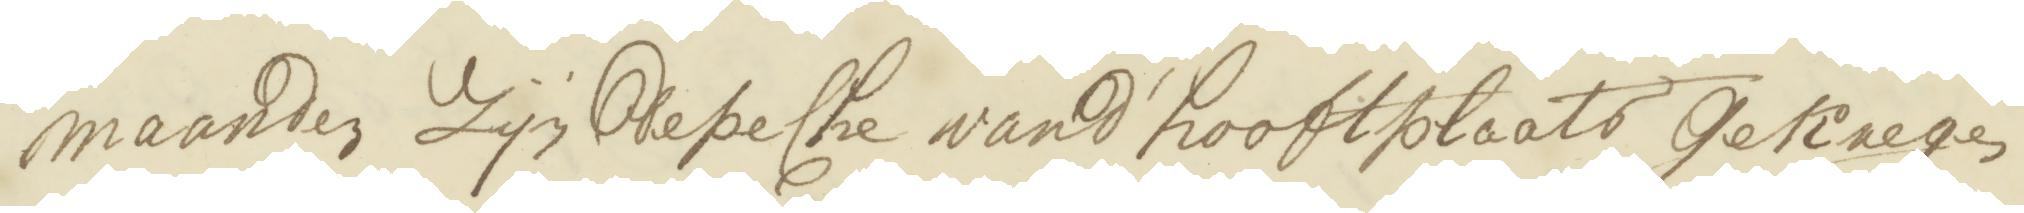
maanden Zijn depeche van d’ hooftplaats gekregen
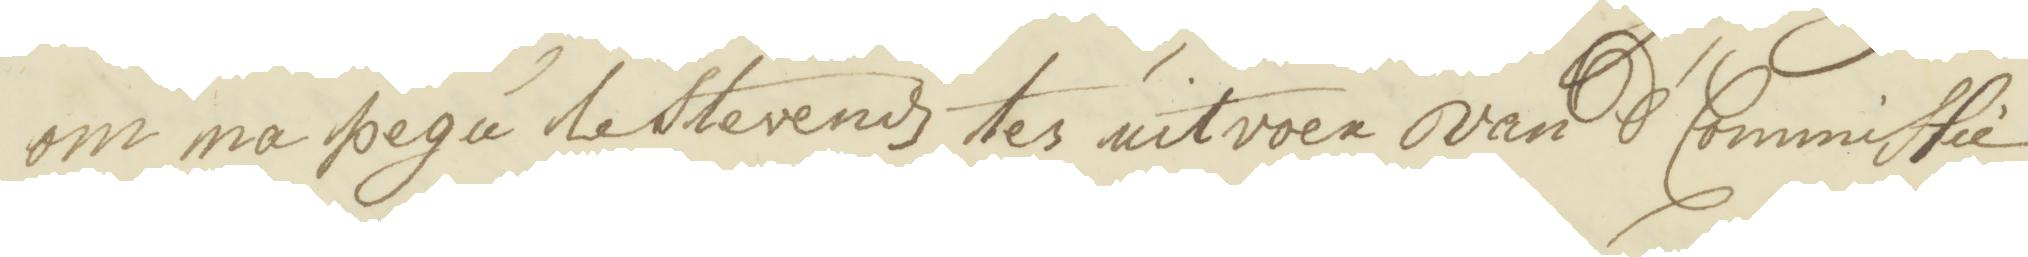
om na pegu te stevenen ten uit voer van d’ Commissie
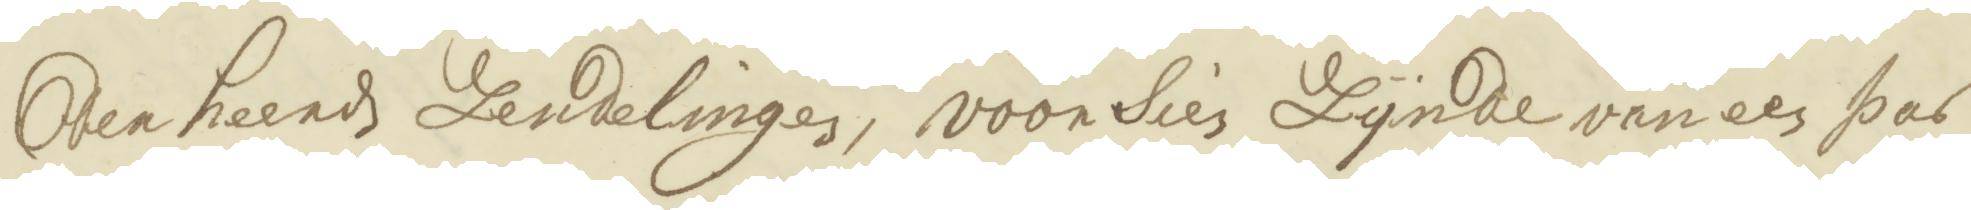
der heeren Zendelingen, voorsien Zijnde van een pas
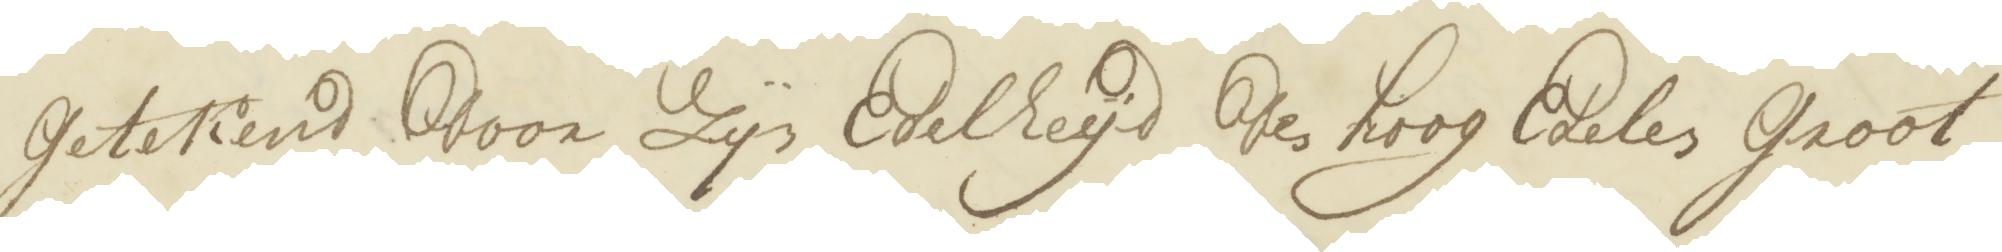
getekend door Zijn Edelheijd den hoog Edelen Groot
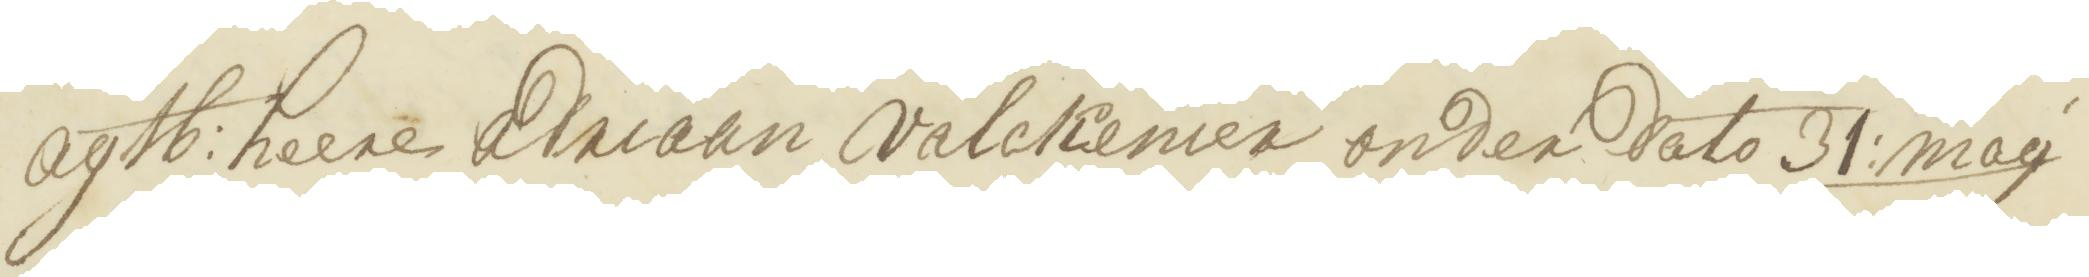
agtb: heere adriaan valckenier onder dato 31:' maij
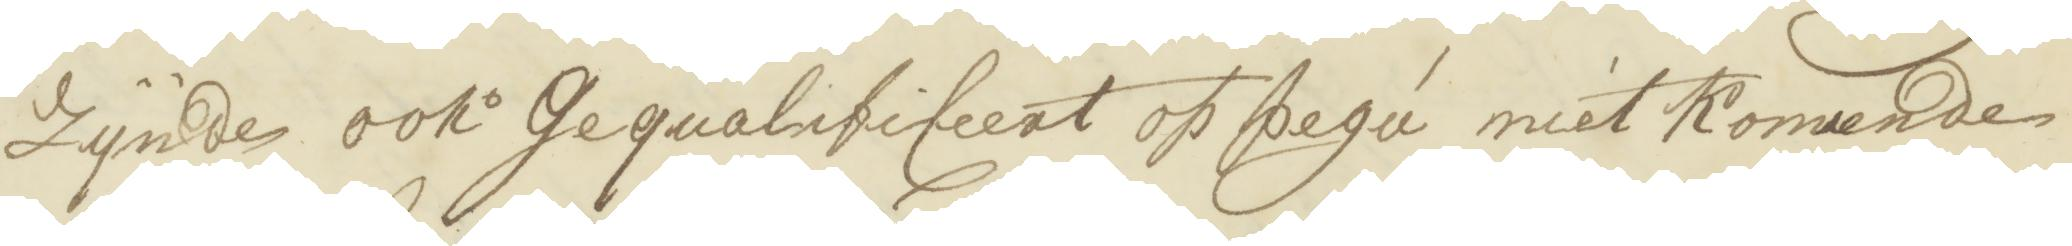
Zijnde ook gequalificeert op pegu niet konnende
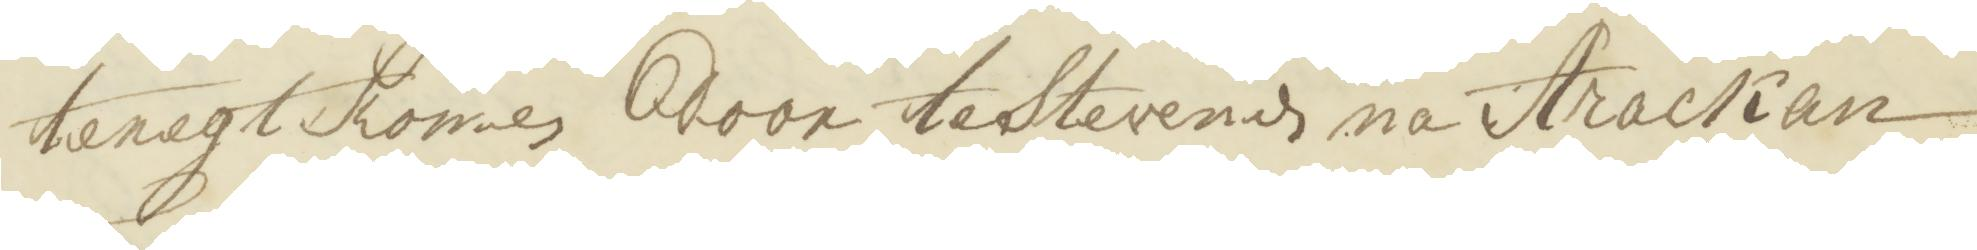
teregt komen door te stevenen na Arackan
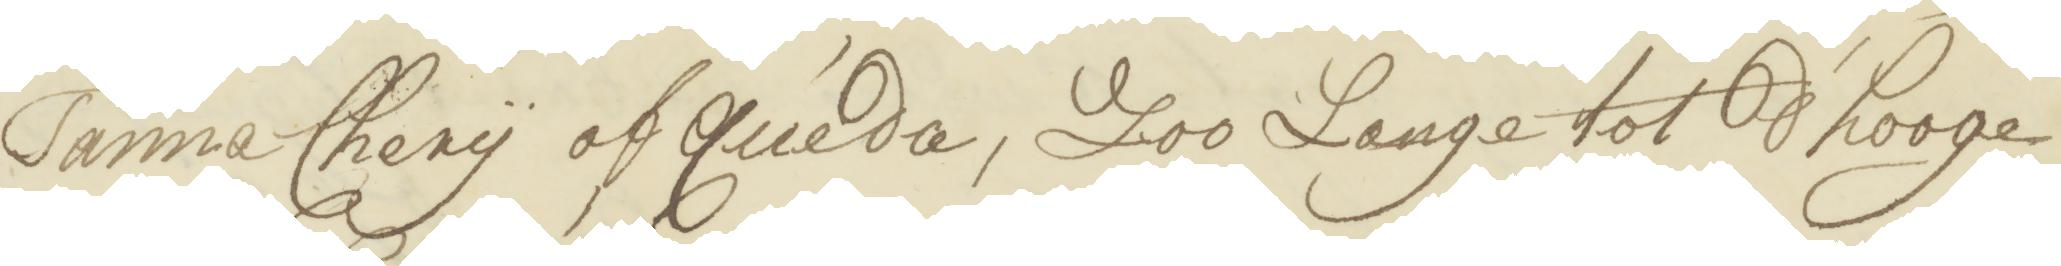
Tanna Cherij of queda, Zoo Lange tot d'hooge
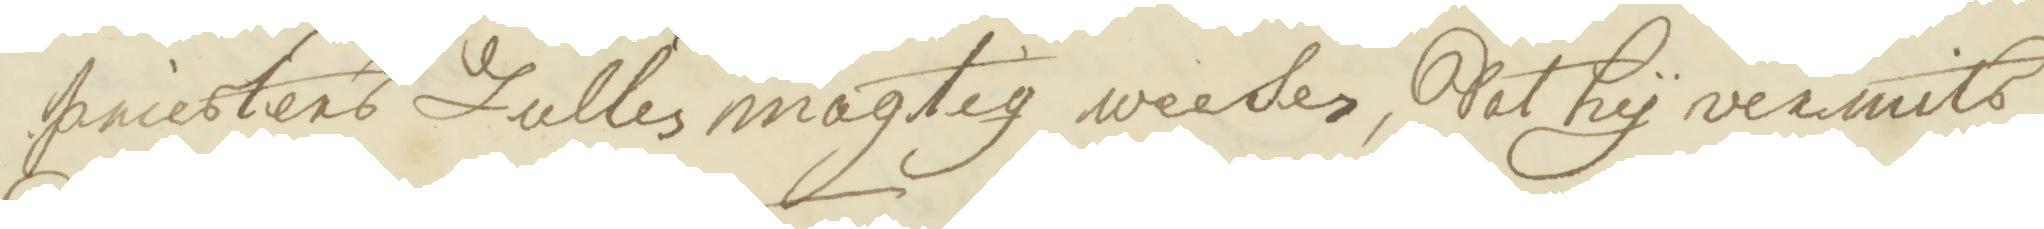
priesters Zullen magtig weesen, dat hij vermits
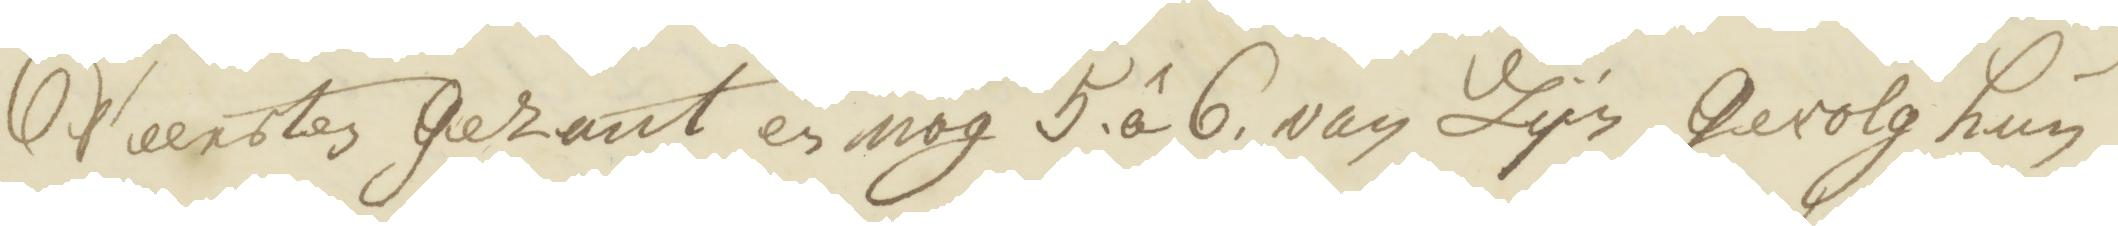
d'eersten gezant en nog 5. â 6. van Zijn Gevolg hun
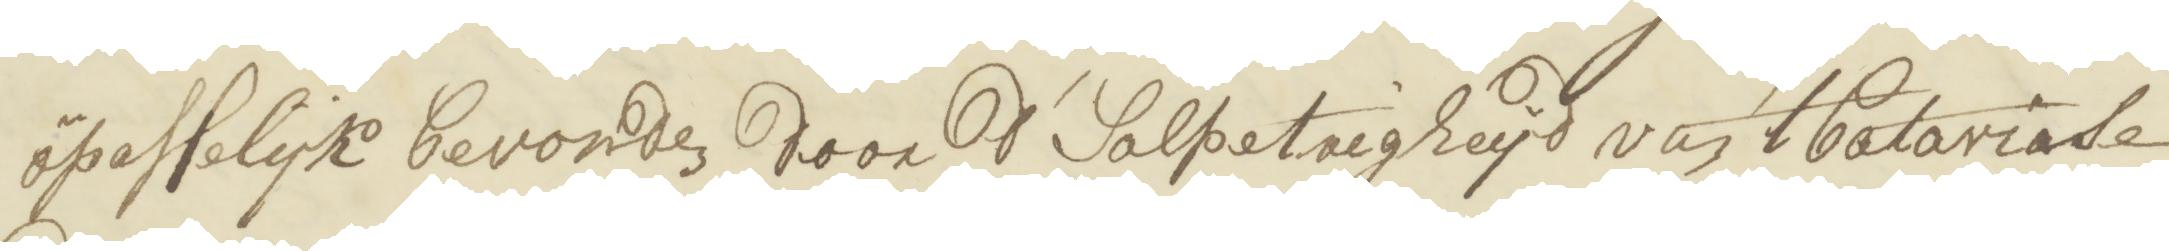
o"n passelijk bevonden door d’Salpetrigheijd van ’t bataviase
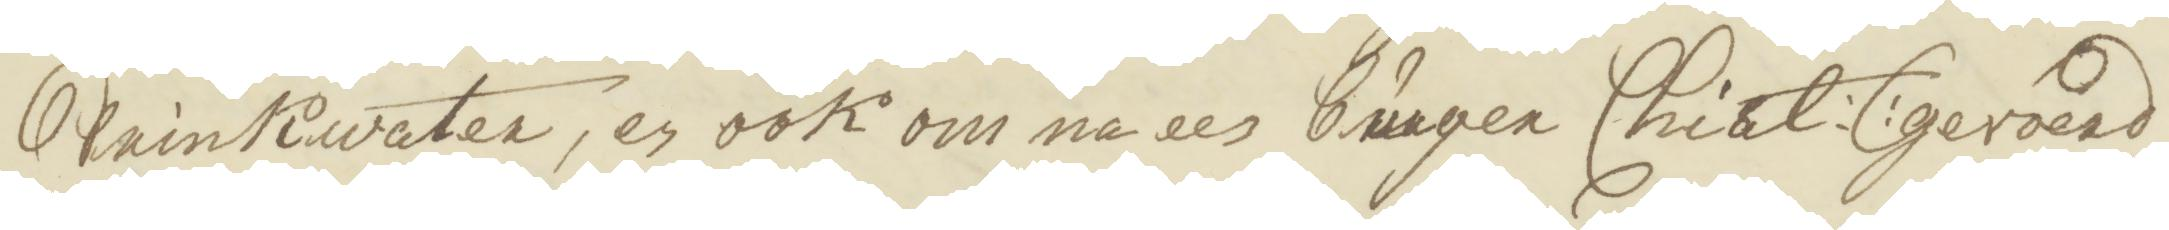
drinkwater, en ook om na een burger Chial: (:gevoerd
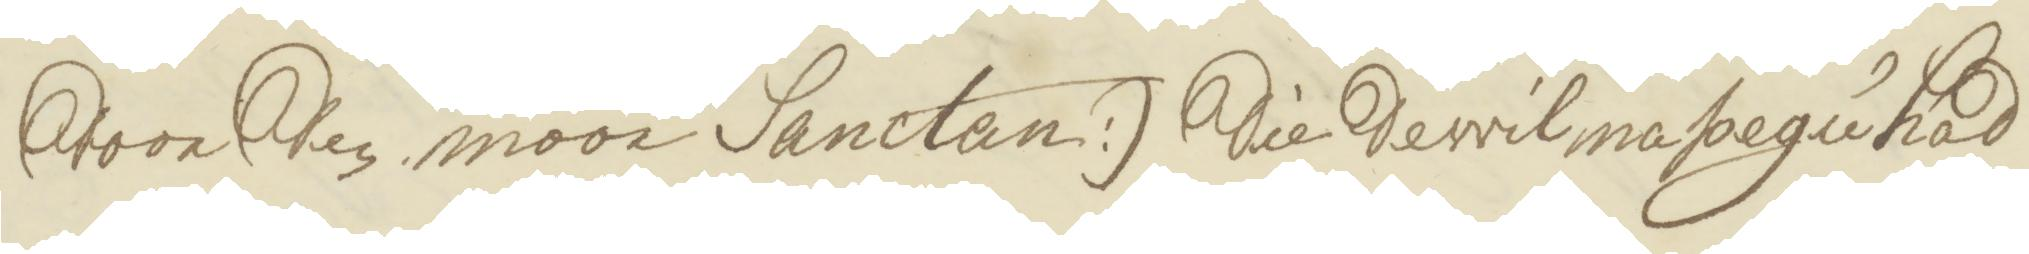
door den moor Sanctan:) die de wil na pegu had
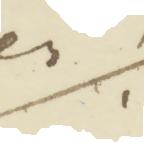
(: er
